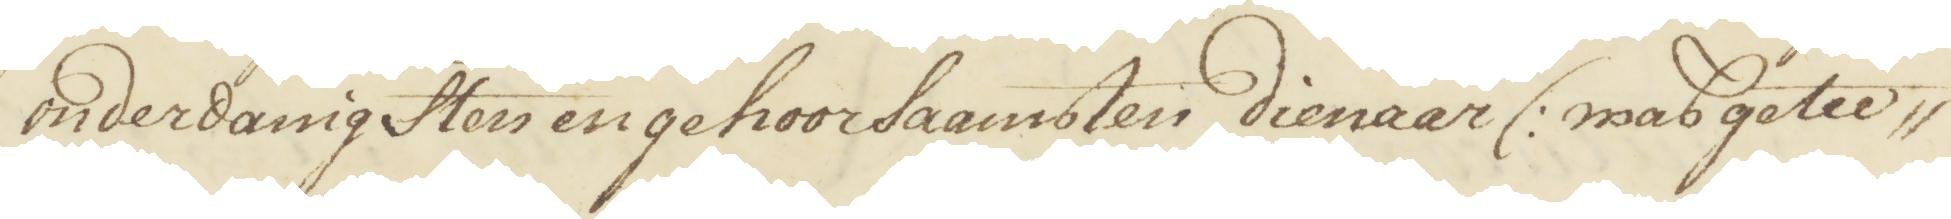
onderdanigsten en gehoorsaamsten dienaar (:was getee„
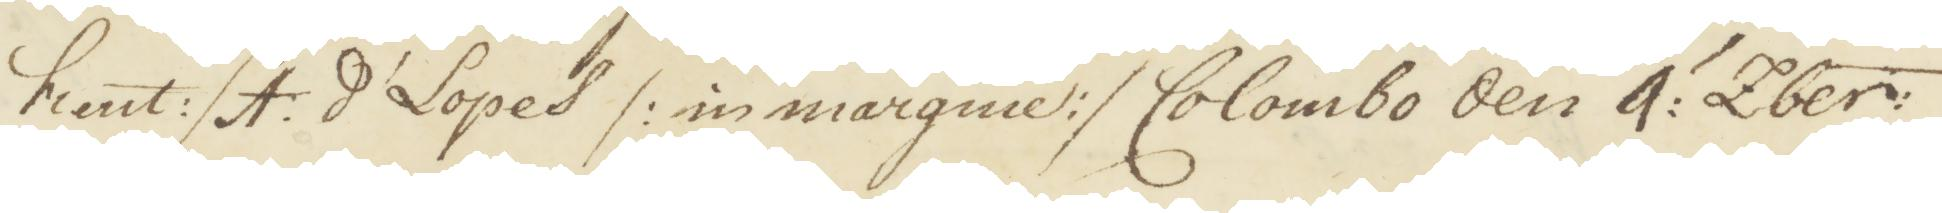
kent:/ A: d’ Lopes /:in margine:/ Colombo den 4:' Zber:
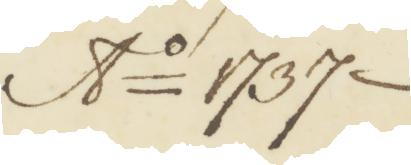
A=o 1737—
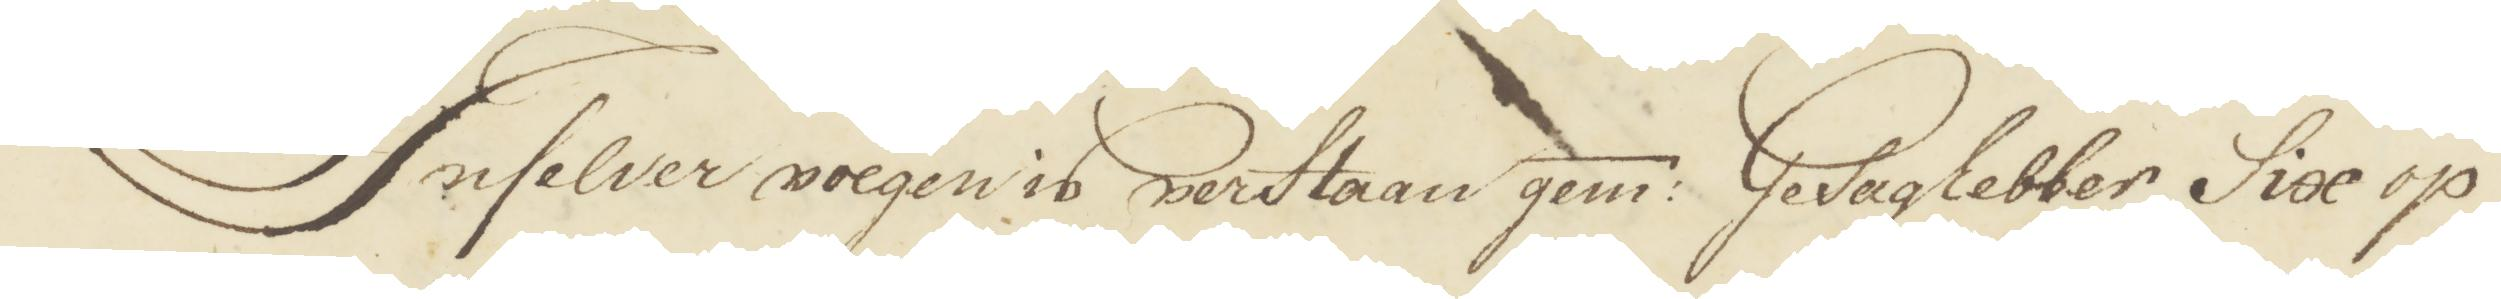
Jnselver voegen is verstaan gem: Gesaghebber Six op
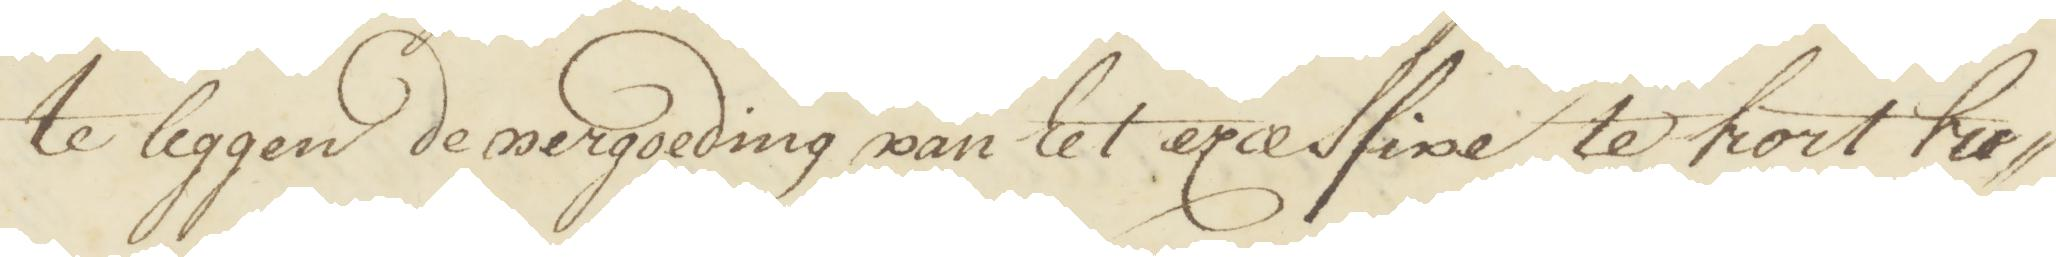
te leggen de vergoeding van het excessive te kort ko„
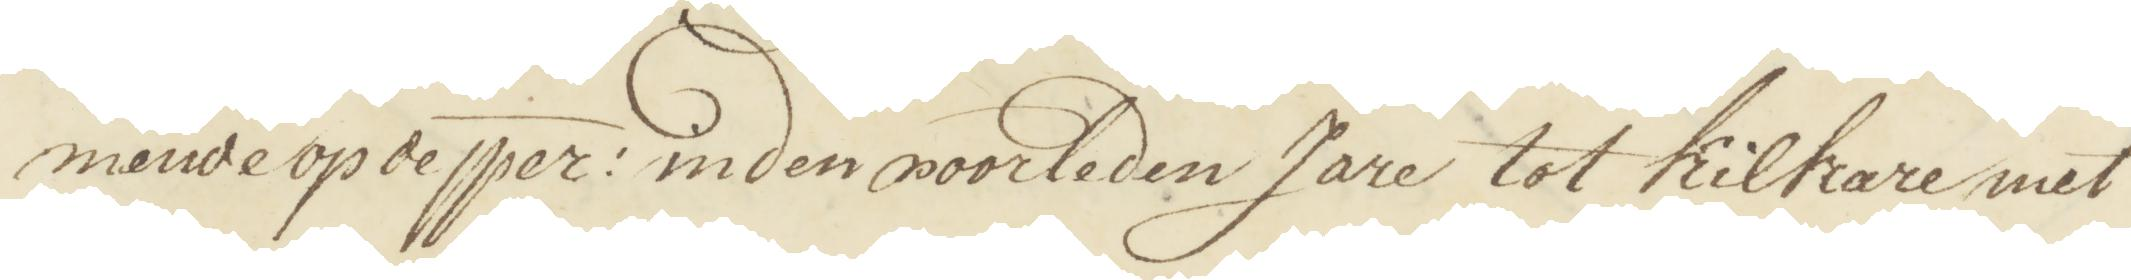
mende op de pper: in den voorleden Jare tot kilkare met
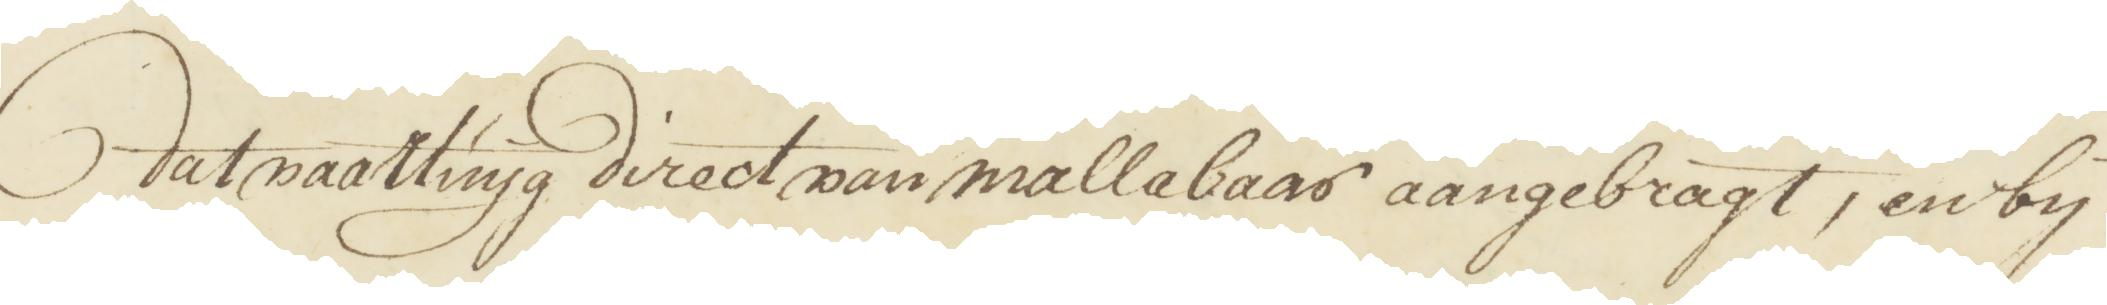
dat vaartuijg direct van mallabaas aangebragt, en bij
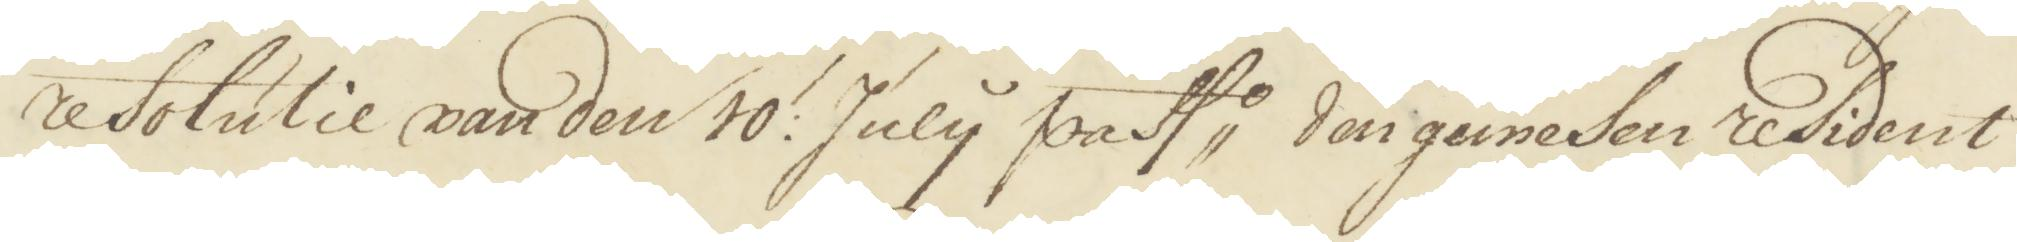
resolutie van den 10:' Julij pass„o den gewesen resident
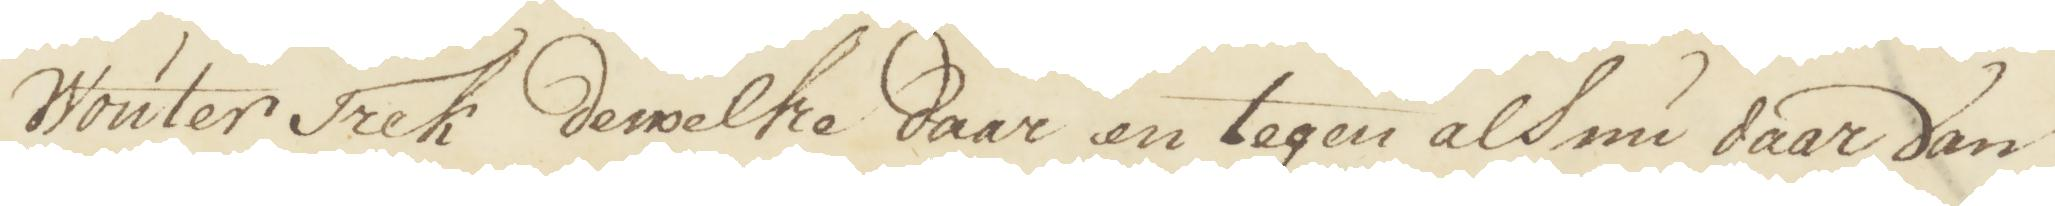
Wouter Trek dewelke daar en tegen als nu daar Van
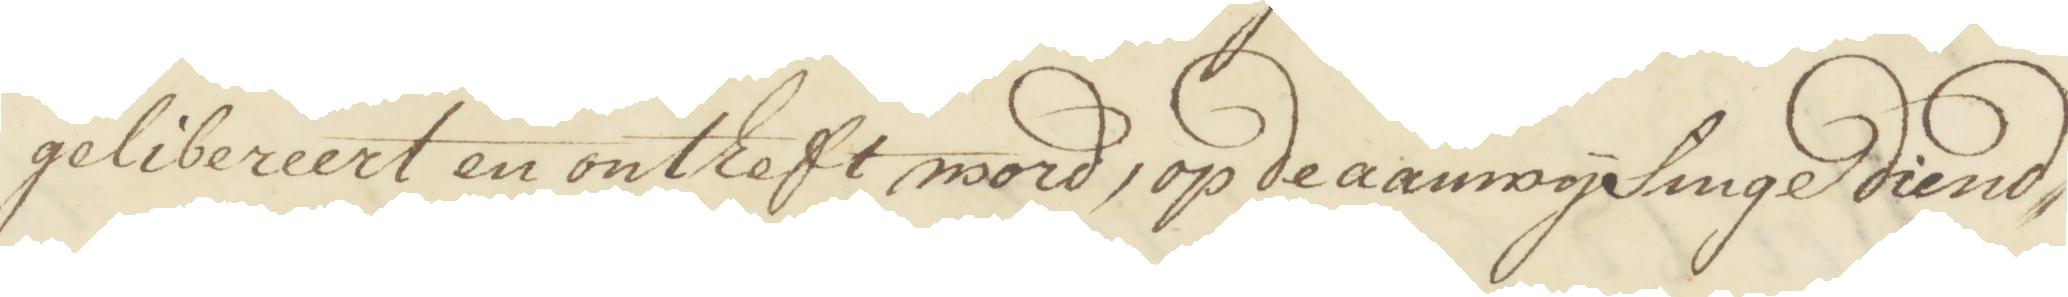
gelibereert en ontheft word, op de aanwijsinge diend„
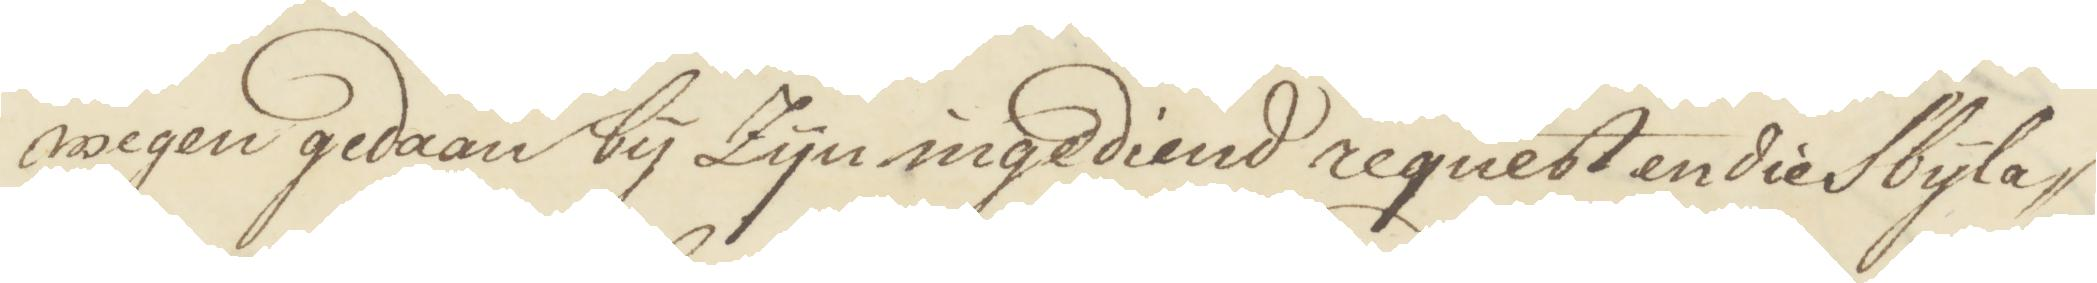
wegen gedaan bij zijn ingediend request en dies bijla„
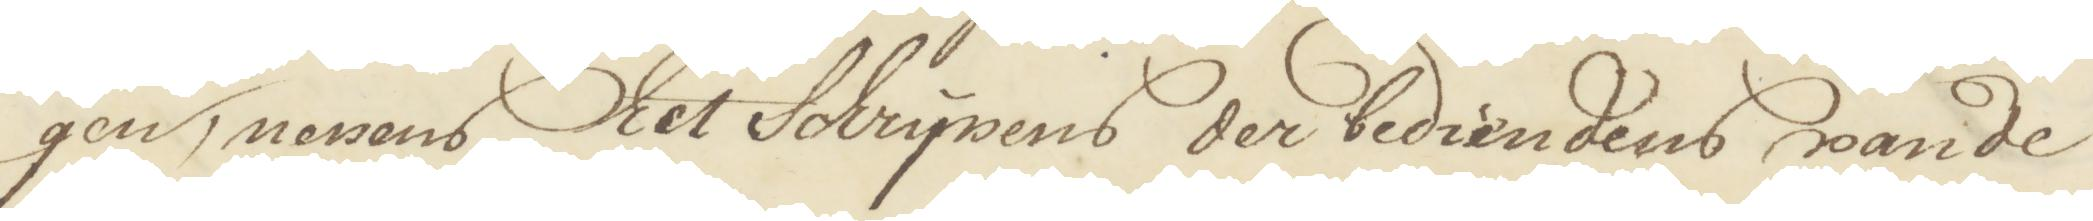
gen, nevens het schrijvens der bediendens van de
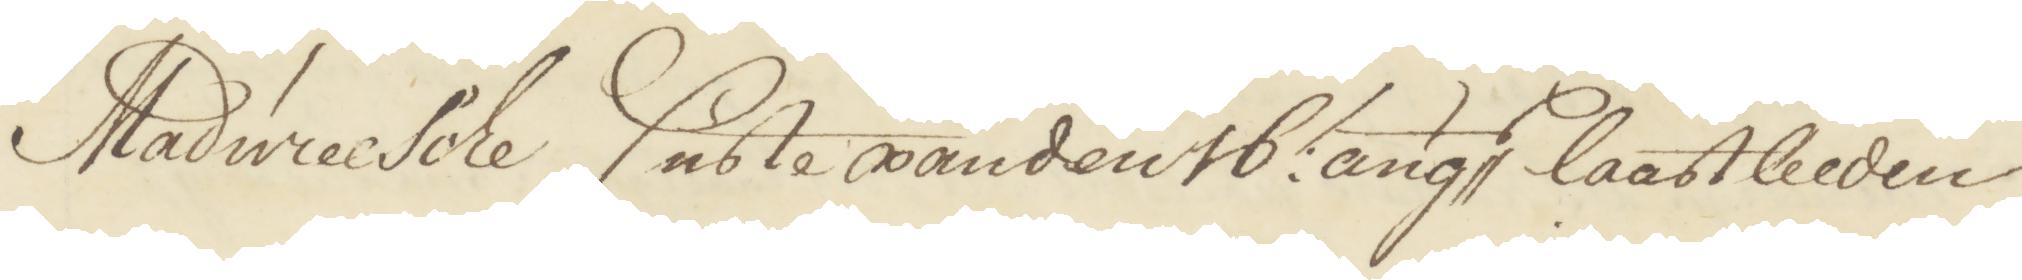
Madureesche Custe vanden 16:' aug„s laastleeden
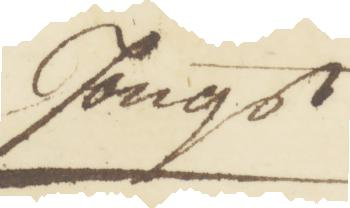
Jongs
